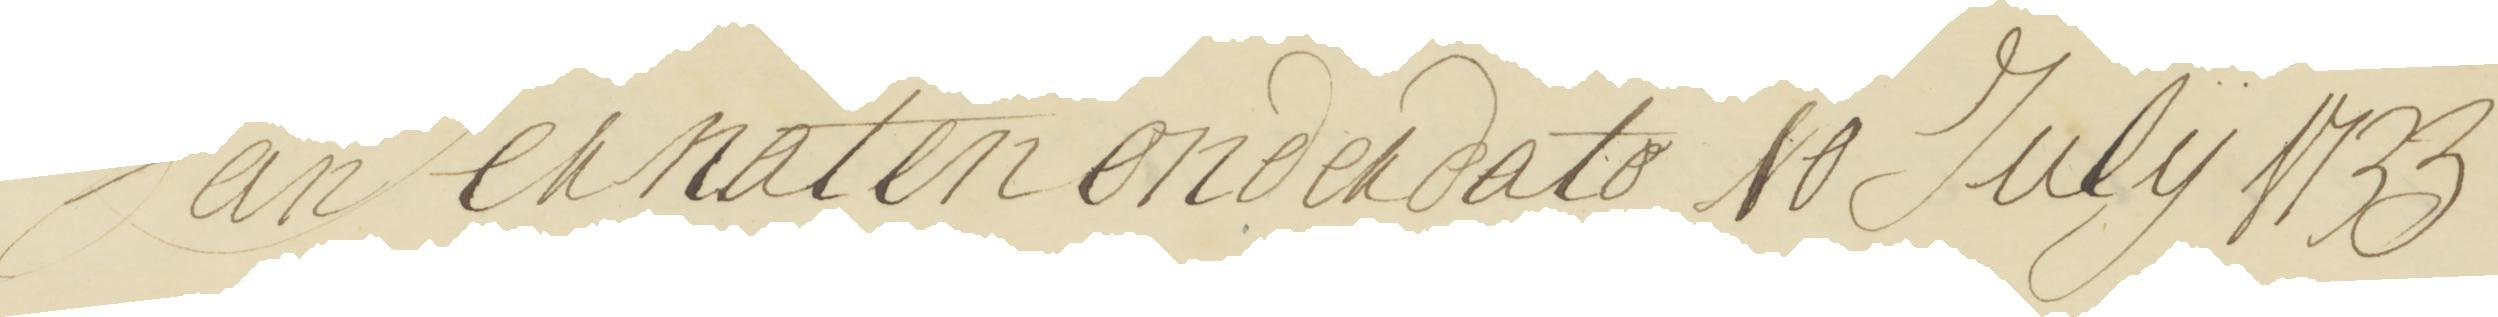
Van Ternaten onder dato 10 Julij 1733
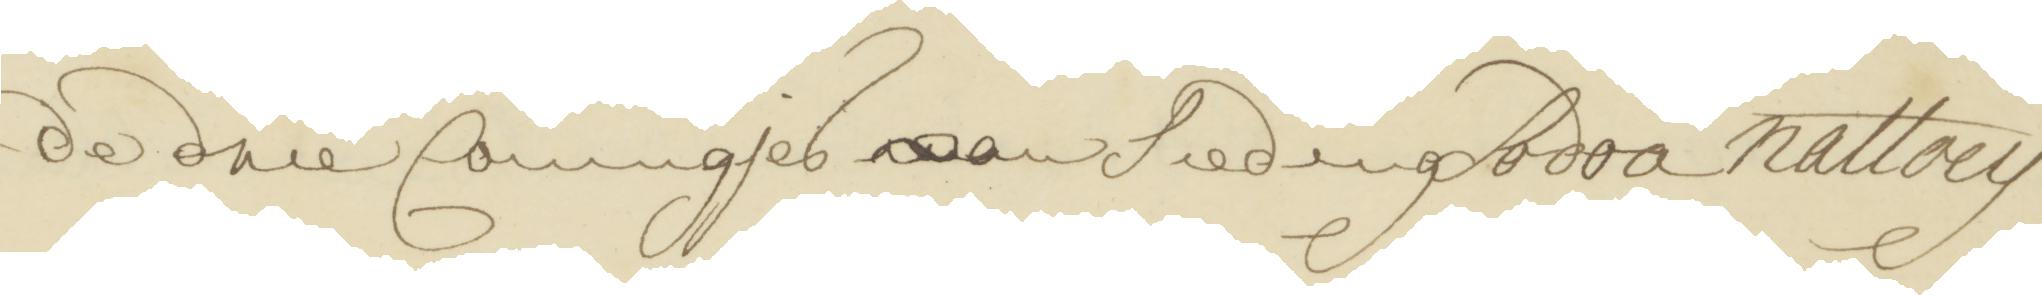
de drie Coningjes van Sieding Sodoa nattoey
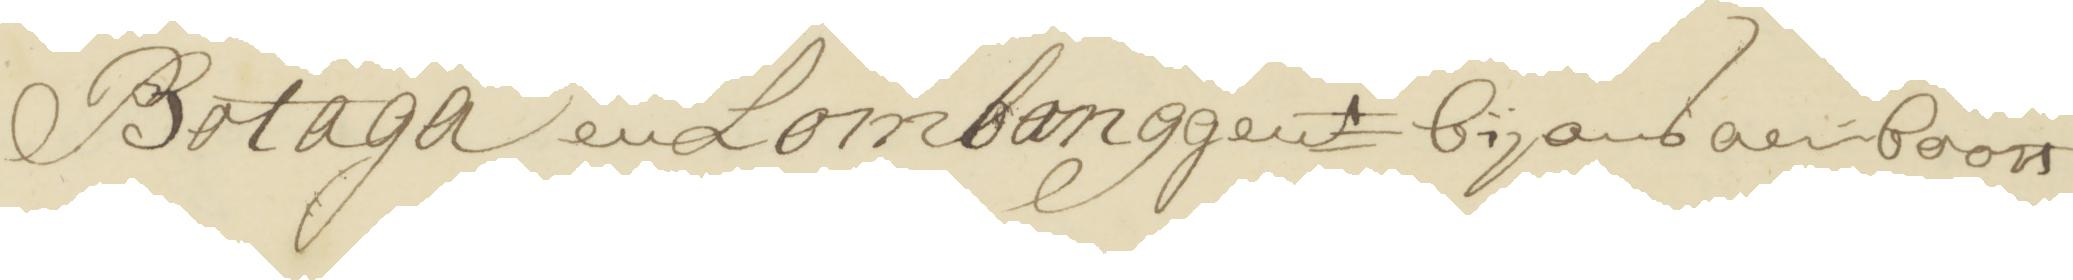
Botaga en Lombang gen=t bij ons aen boort
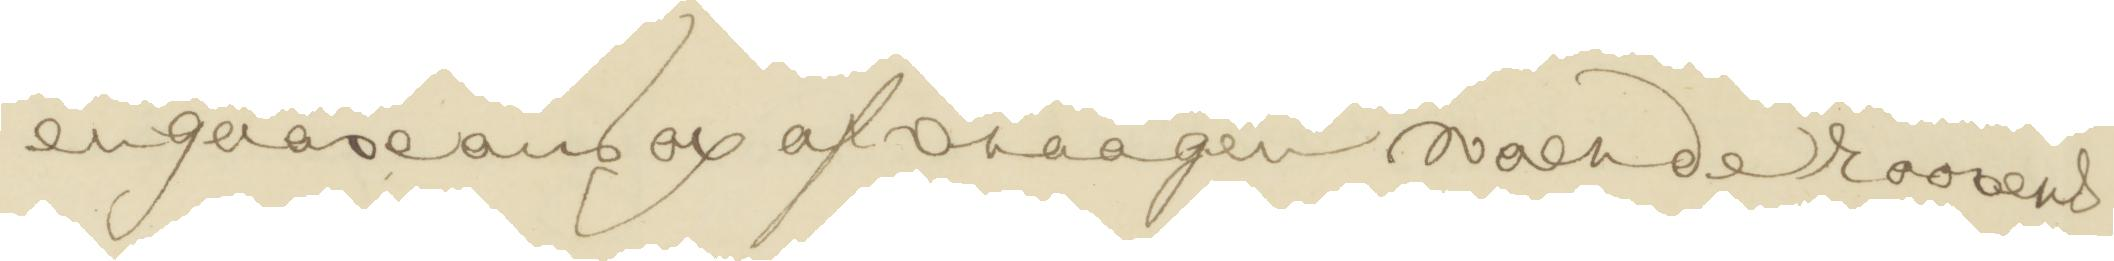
en gaave ons op afvraagen waer de roovers
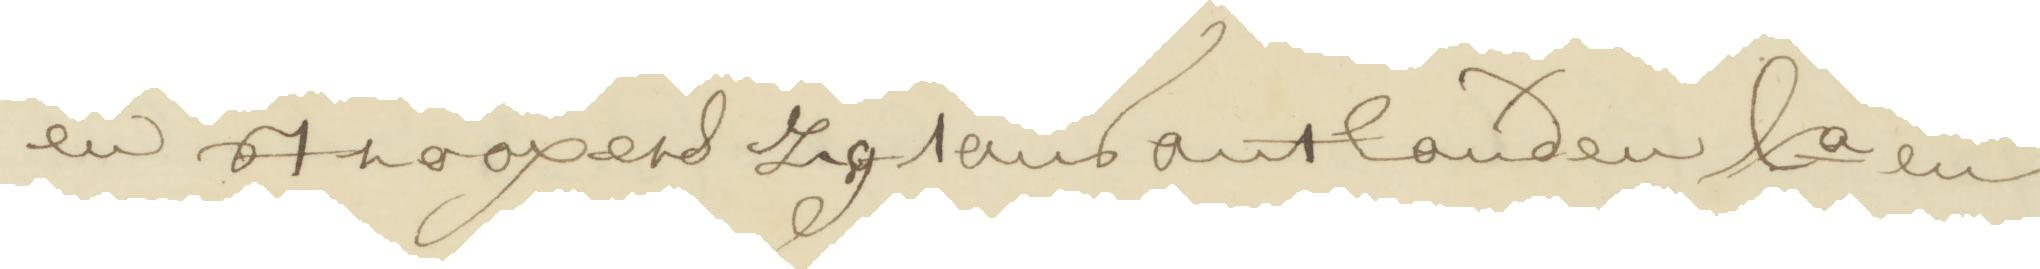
en stroopers zig tans onthouden &=a en
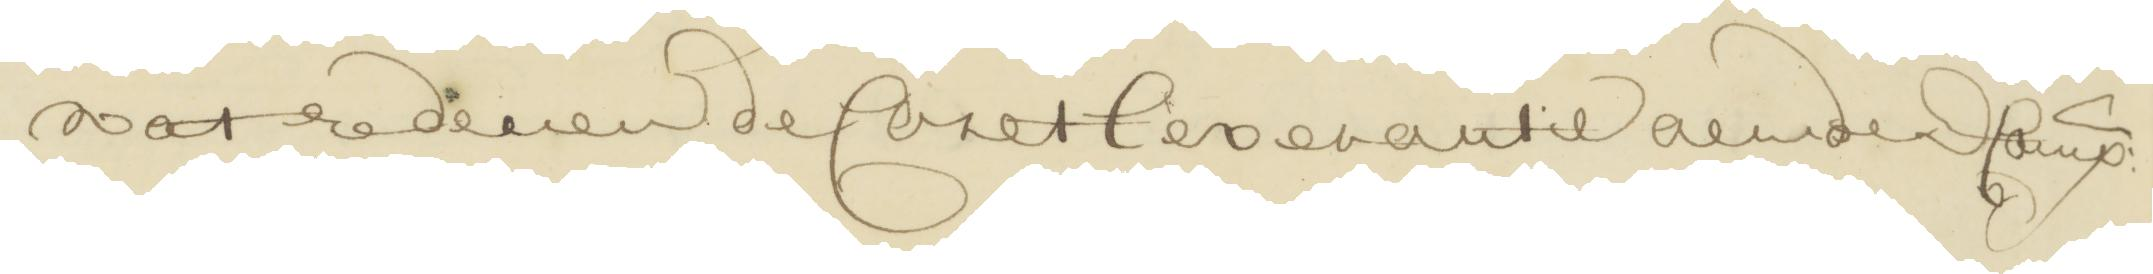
wat redenen de Coret leverantie aende EComp:
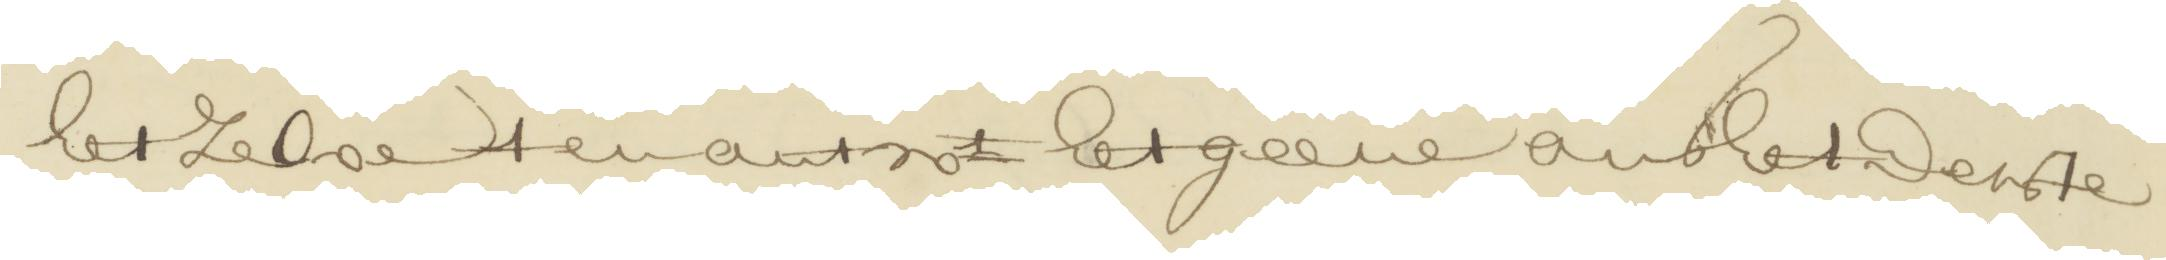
het zelve ten antw=t het geene ons het Eerste
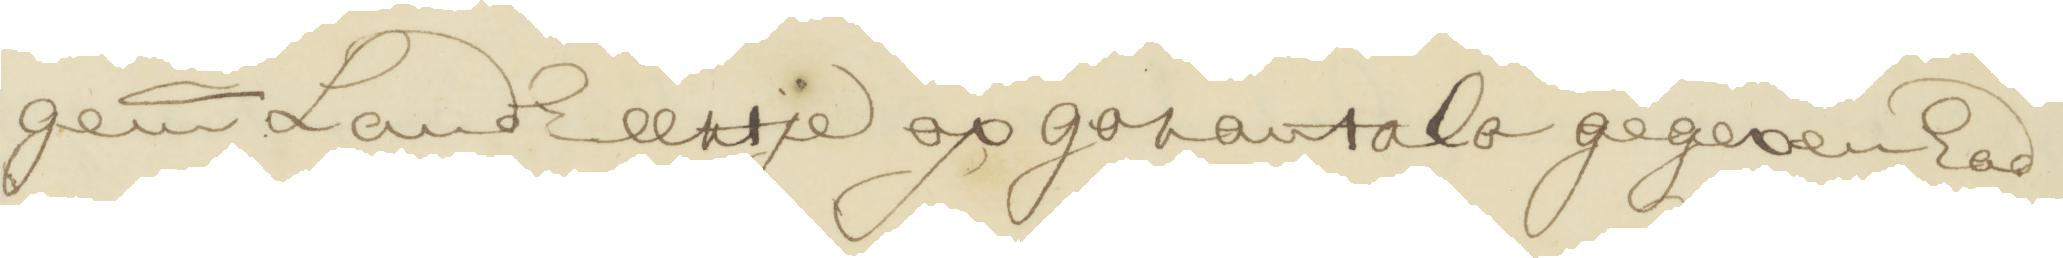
gem Land heertje op gorontalo gegeven had
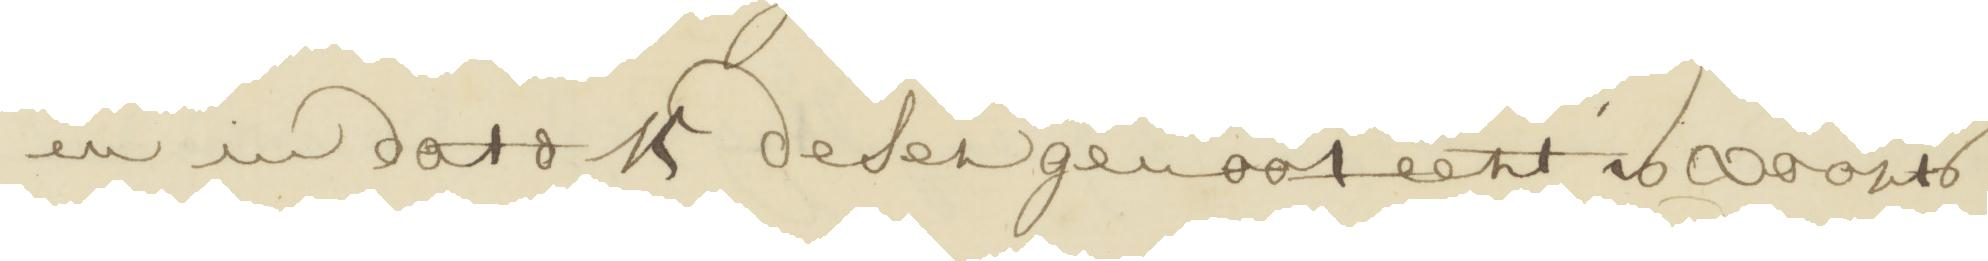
en in dato 15 deser genooteert is voorts
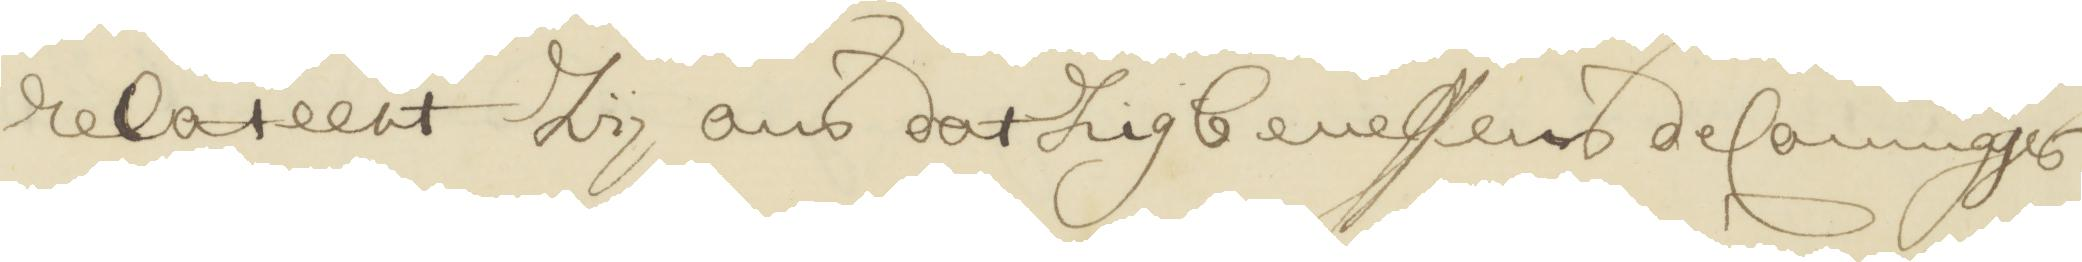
relateert zij ons dat zig beneffens de Coningjes
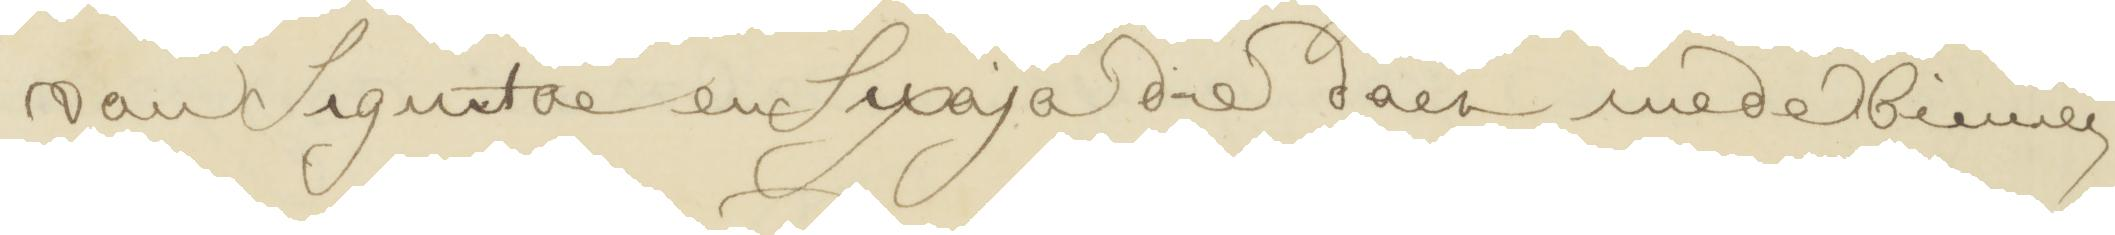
van Sigurtoe en Sipaja die daer mede binnen
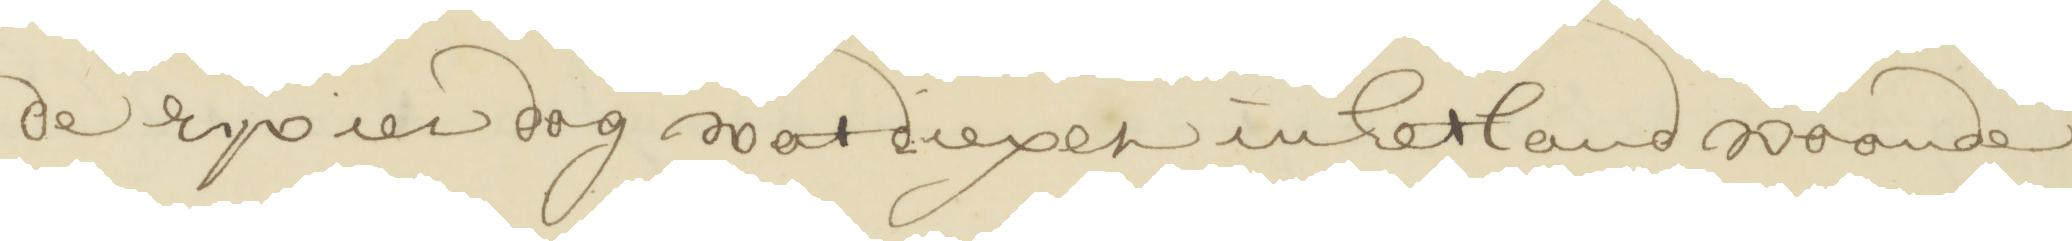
de ryvier dog wat dieper in het land woonde
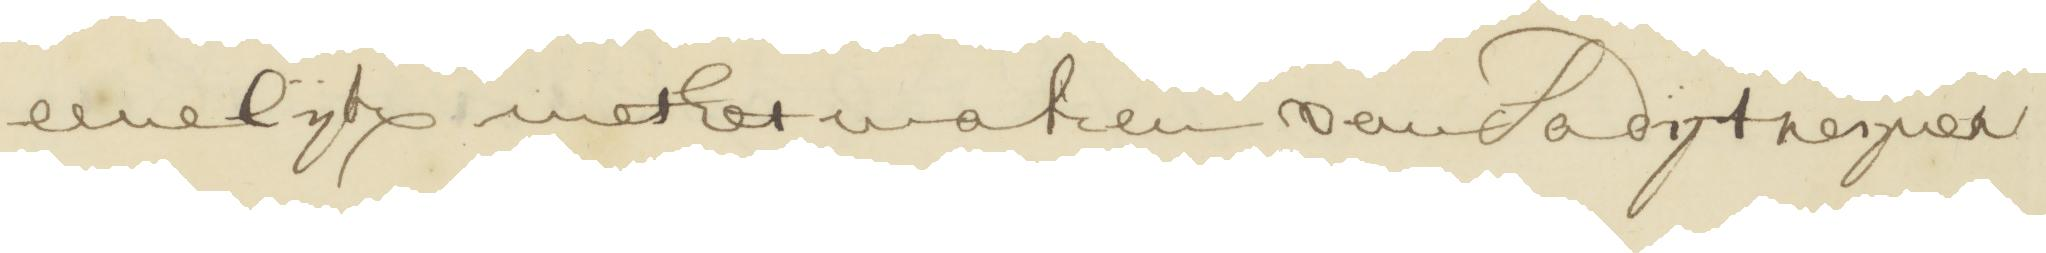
eenelijk met het maken van Sadijtreijner
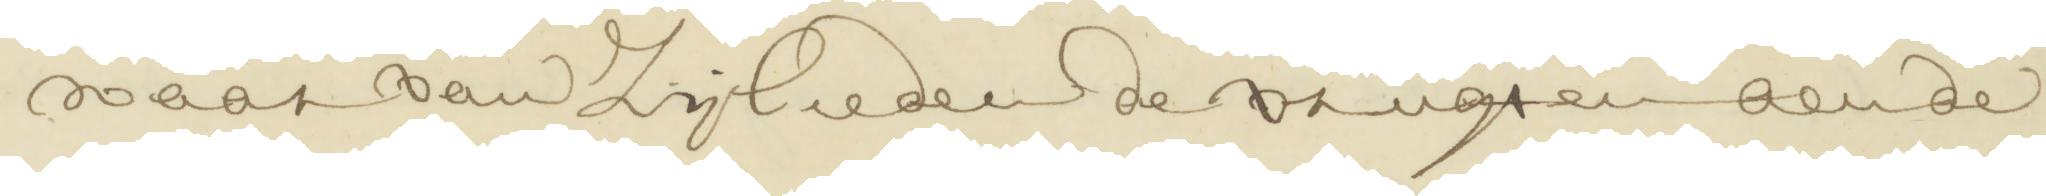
waat van zijlieden de vrugten aen de
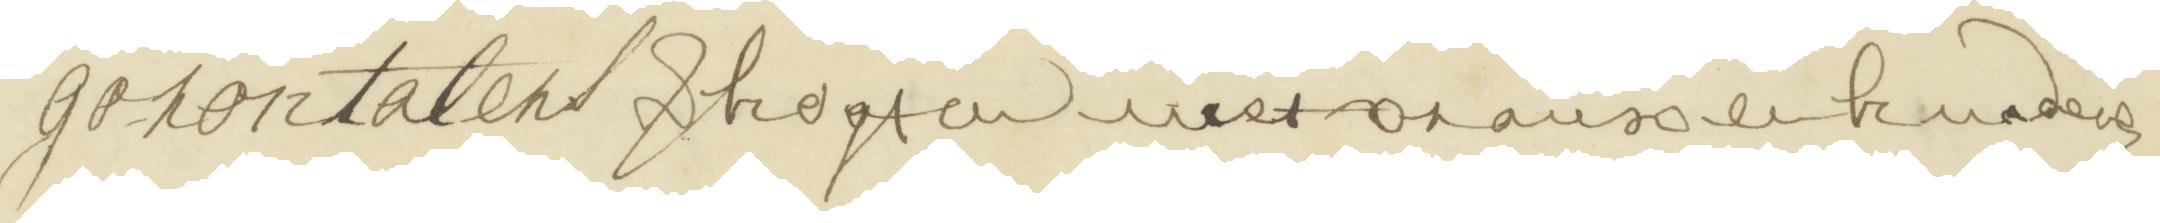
gorontalers verkogten met vrouw en kinderen
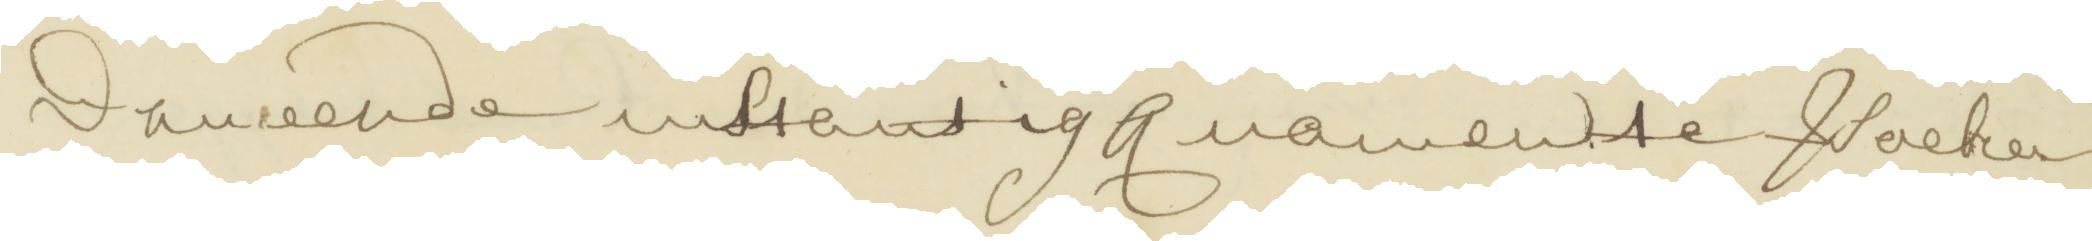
Ermeende instantig quamen te versoeken
